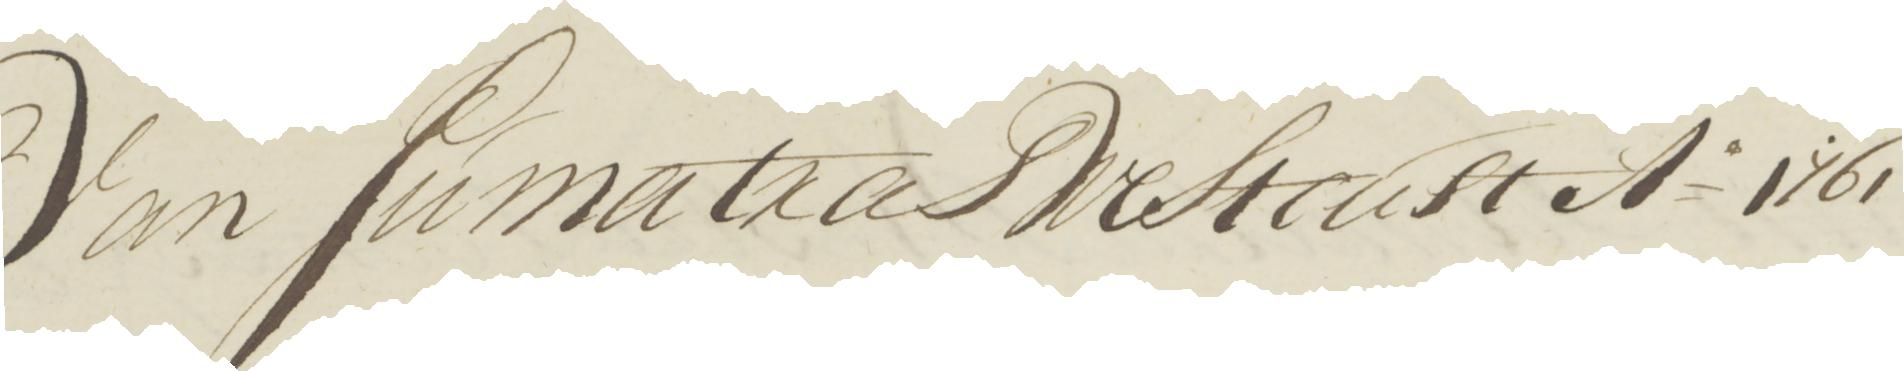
Van Sumatras westcust A=o 1761
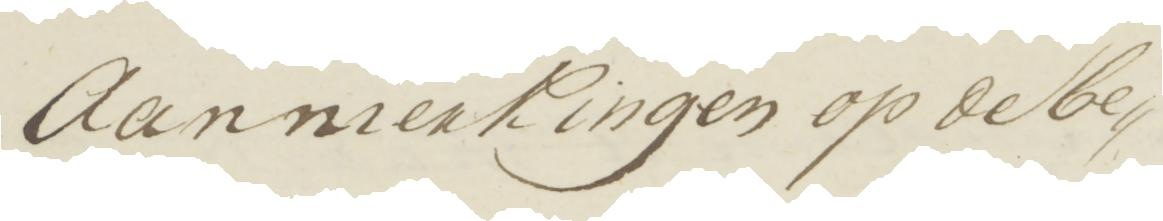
Aanmerkingen op de be„
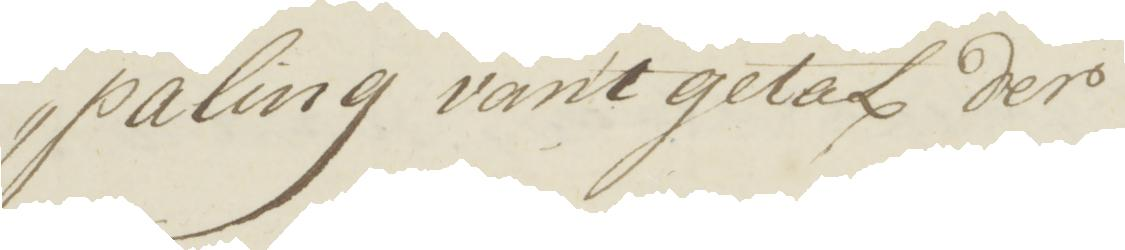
„paling van ’t getal der
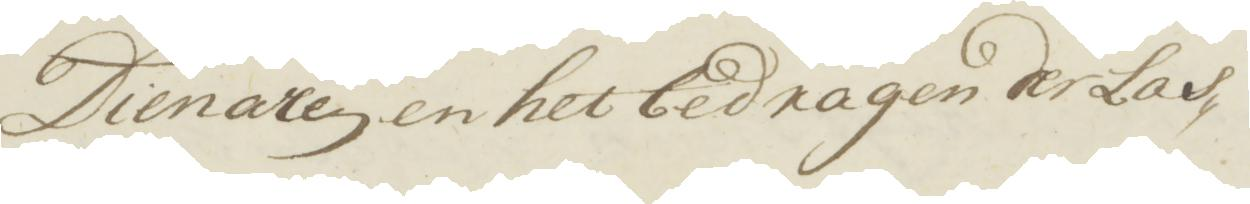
Dienaren en het bedragen der Las„
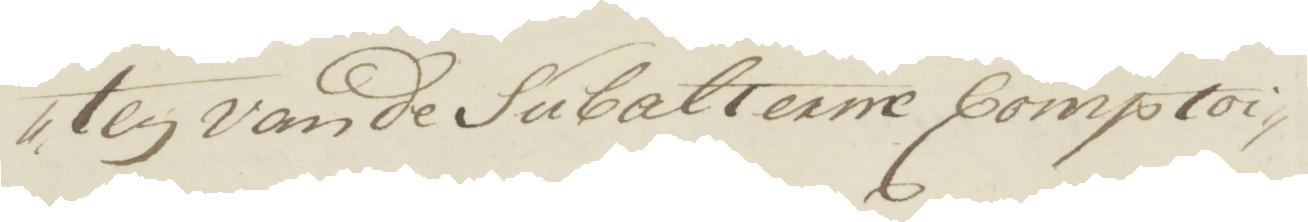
„ten van de subalterne Comptoi„
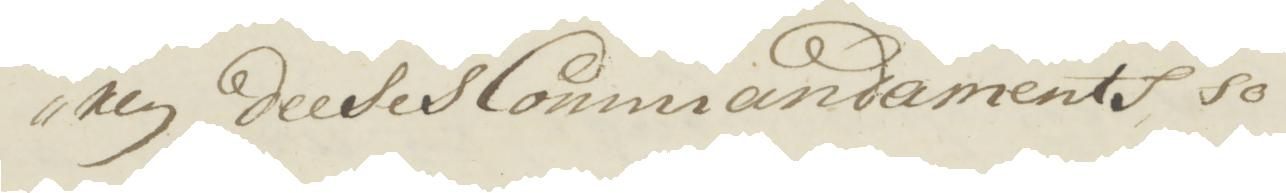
„ren deeses Commandaments, so
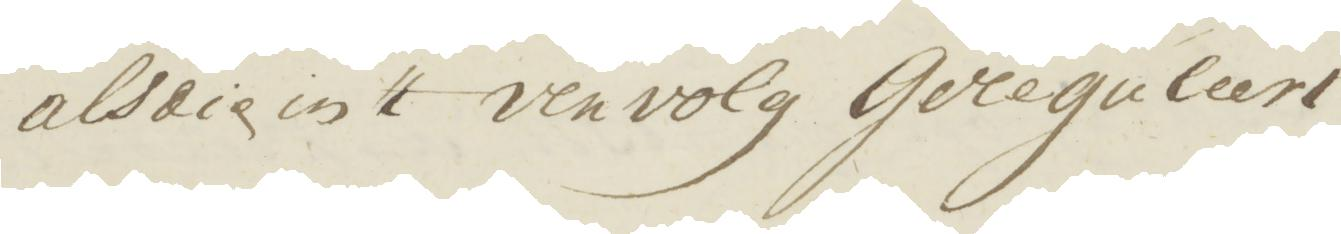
als die in ’t vervolg Gereguleert
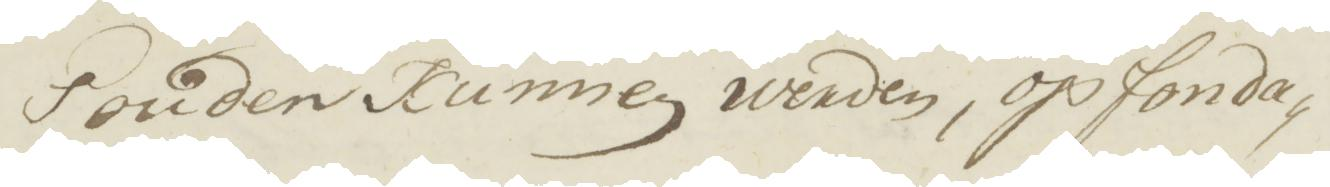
souden kunnen werden, op fonda
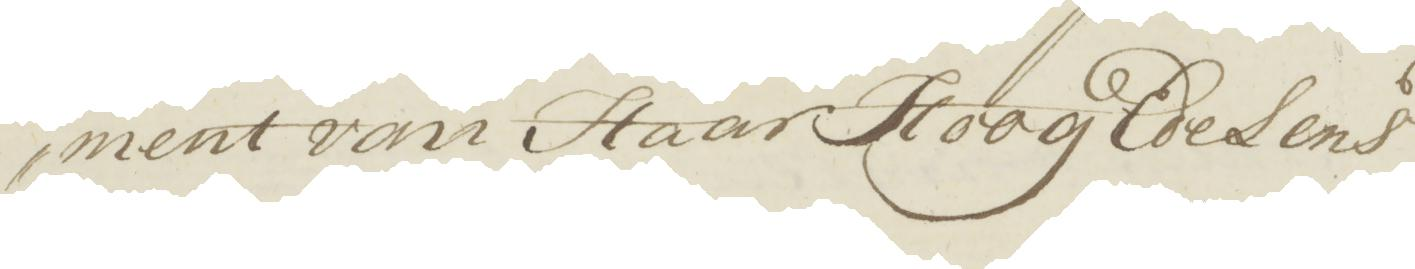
„ment van Haar Hoog Edelens
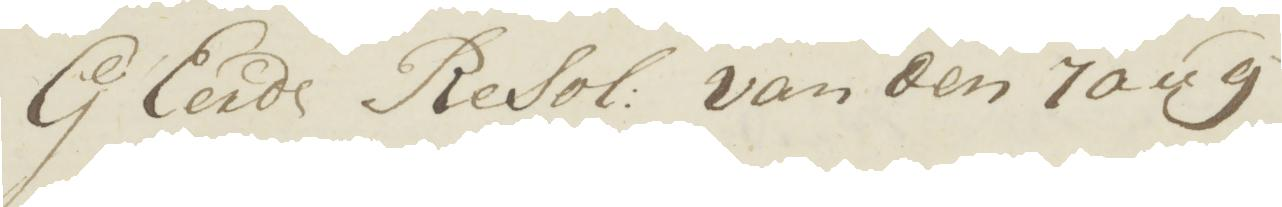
G'Eerde Resol: van den 7 aug
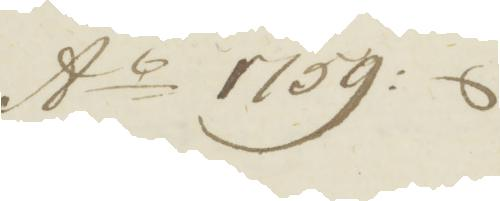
A=o 1759:
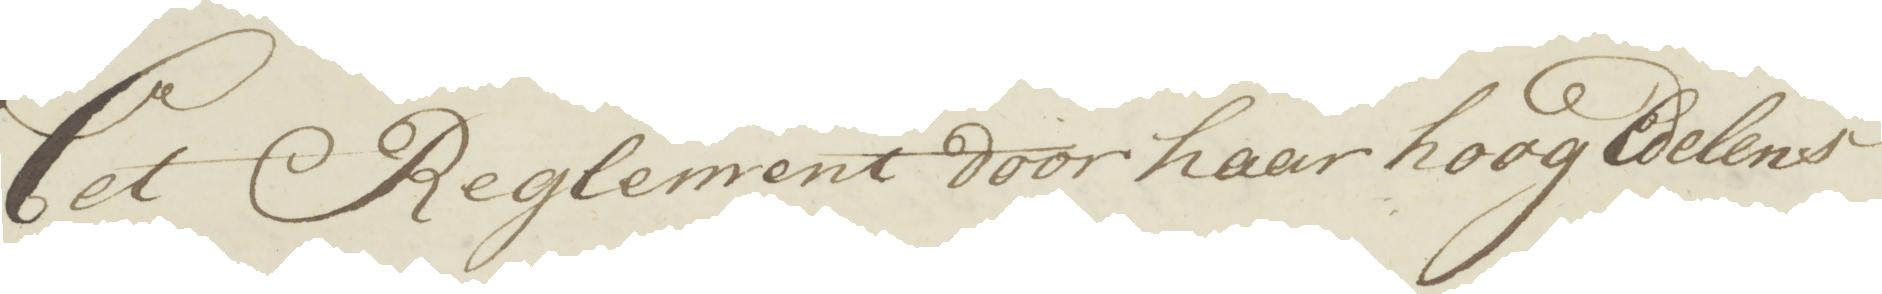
het Reglement door haar hoog Edelens
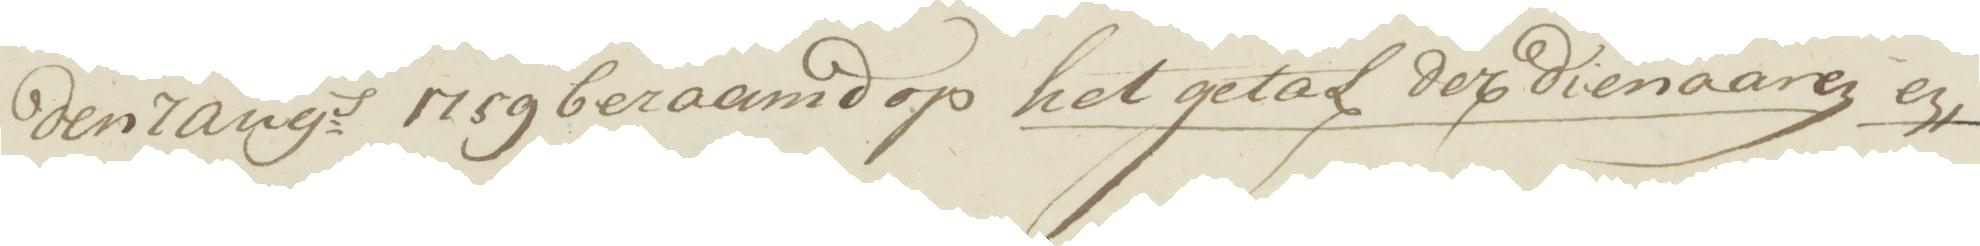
den 7 aug.s 1759 beraamd op het getal der dienaaren en,
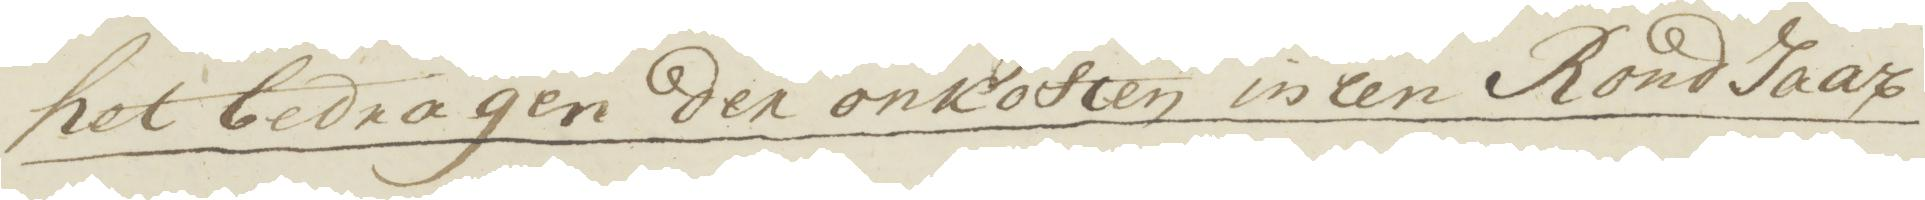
het bedragen der onkosten in een Rond Iaar
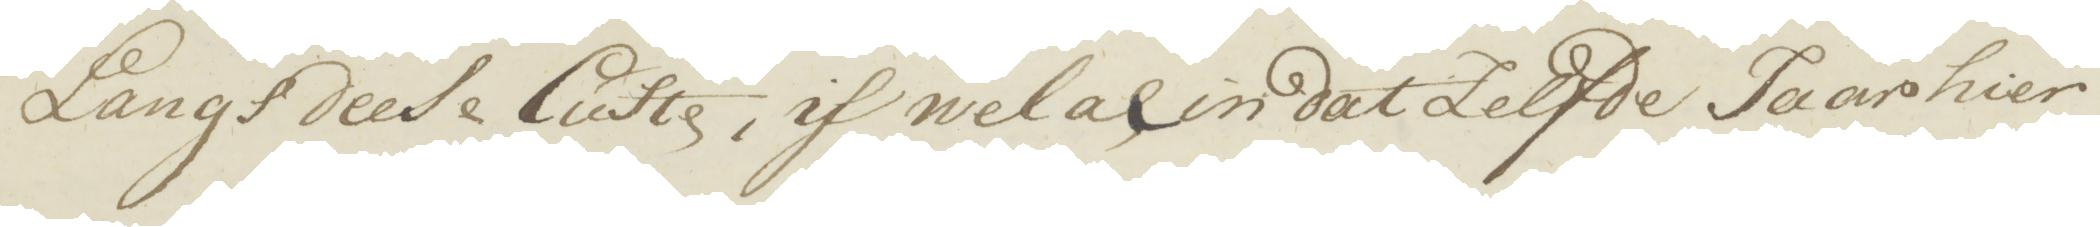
Langs deese Custen, is wel al in dat Zelfde Iaar hier
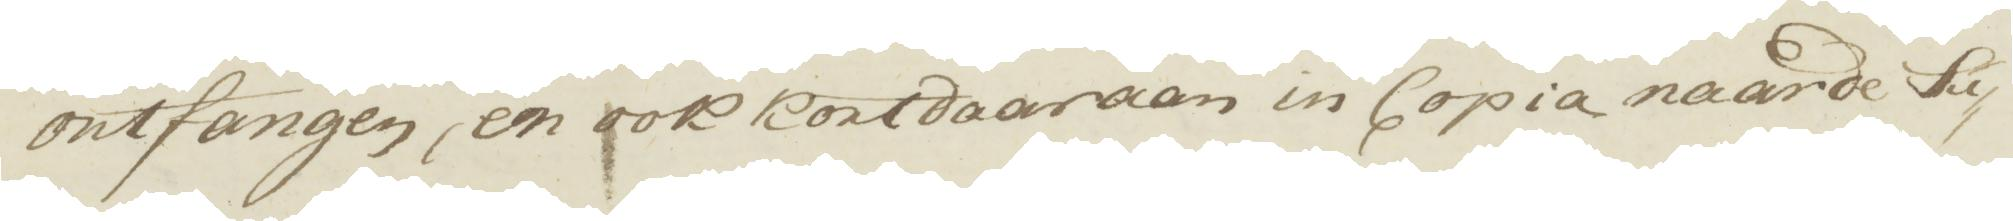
ontfangen, en ook kort daaraan in Copia naar de Su„
